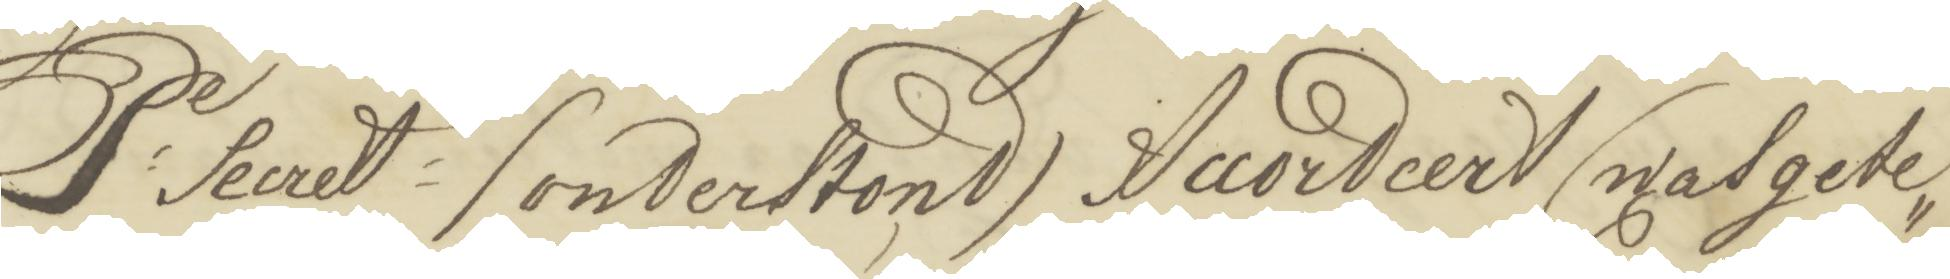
P:l secret=s (onderstond) Accordeert (was gete„
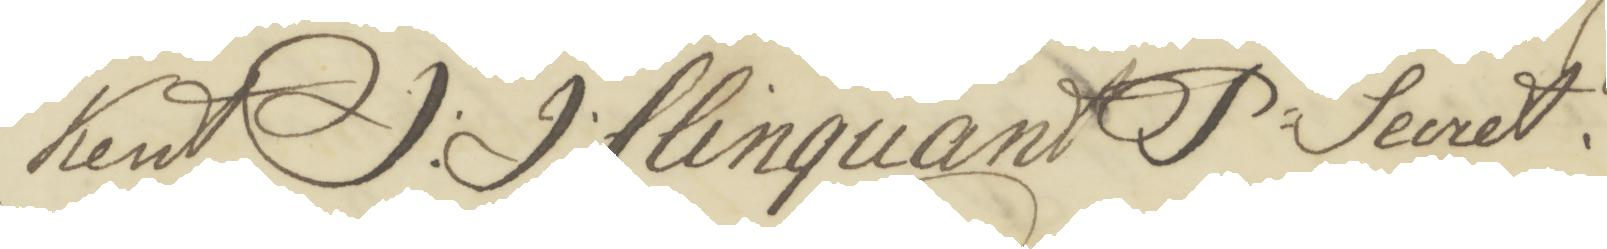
kent I: I: Clinquant P:l Secrets
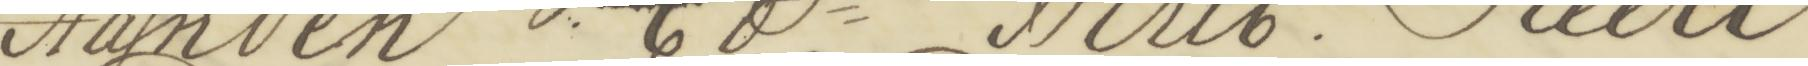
Aan den Ed:len Achtb: Heere
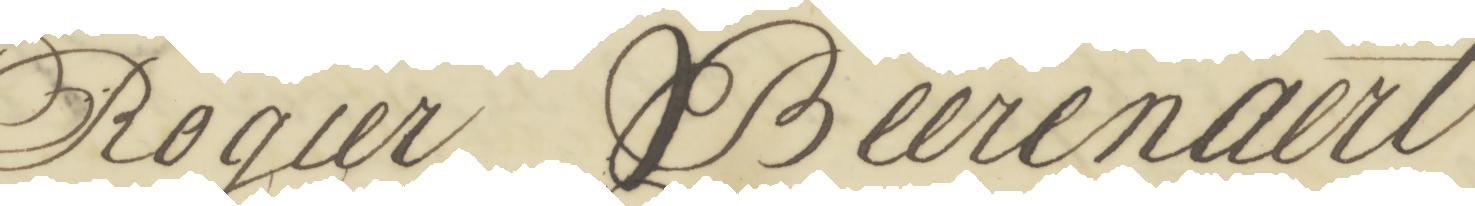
Rogier Beerenaert
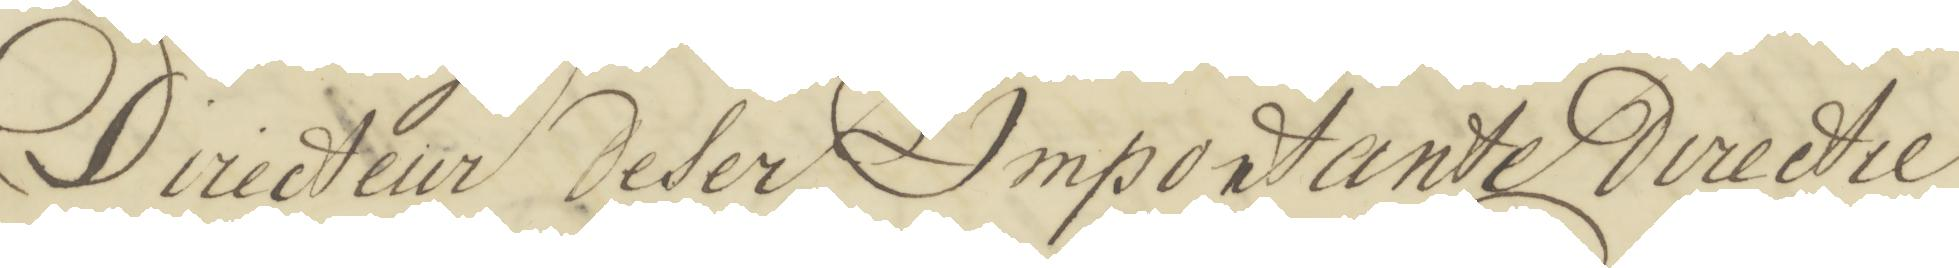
Directeur deser Importante directie
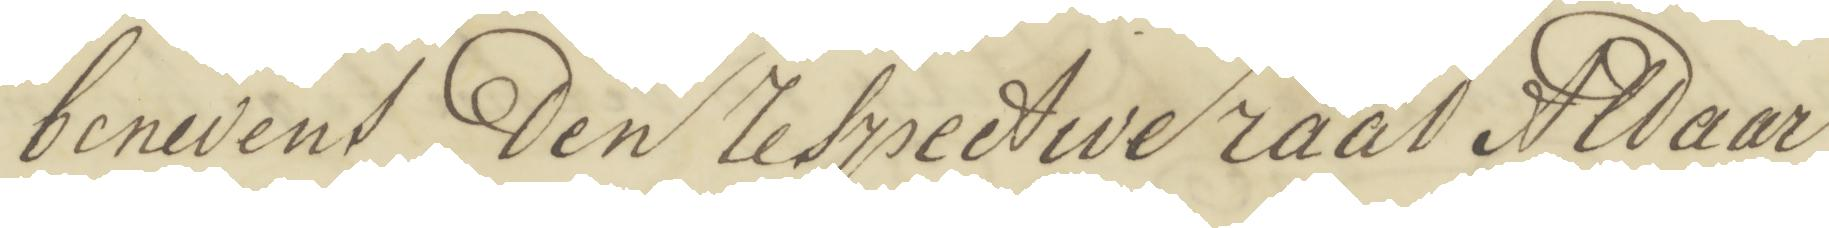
benevens den respective raad Aldaar
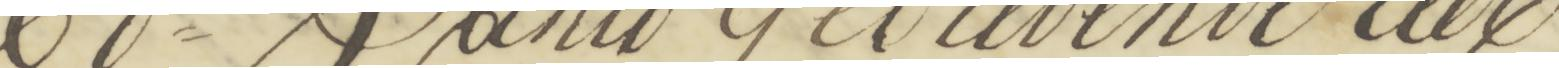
Ed=le Achtb Gebiedende heer
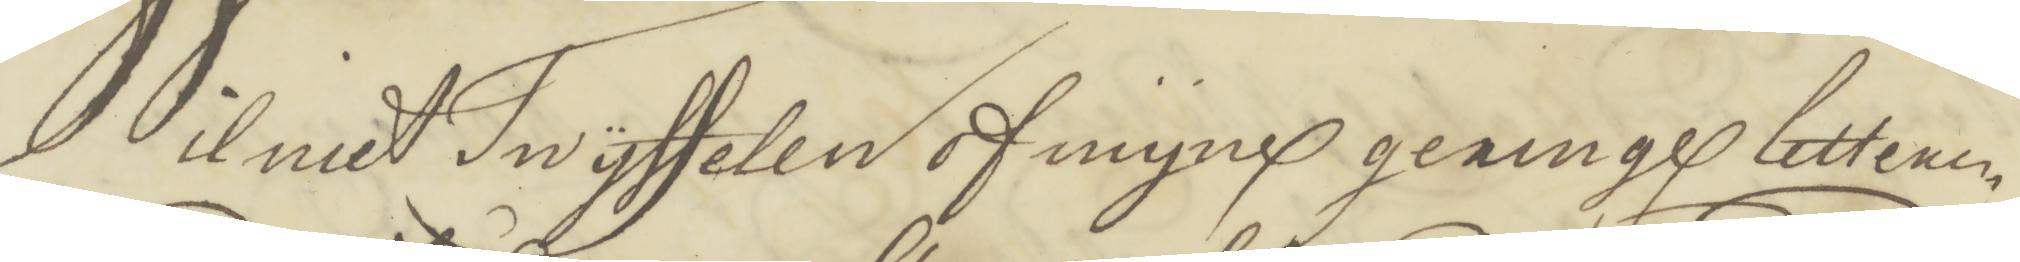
Wil niet Twijffelen of mijne geringe letteren
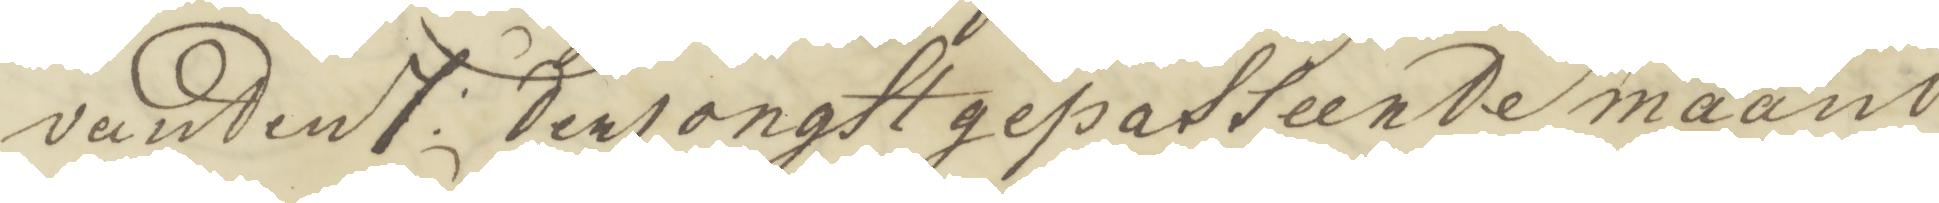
van den 7: ' der jongst gepasseerde maand
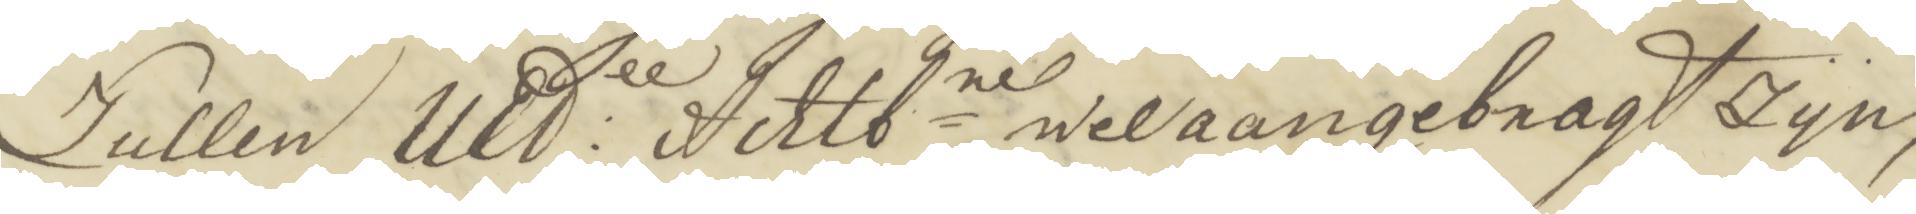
Zullen UEd:le Achtb=re wel aangebragt Zijn,
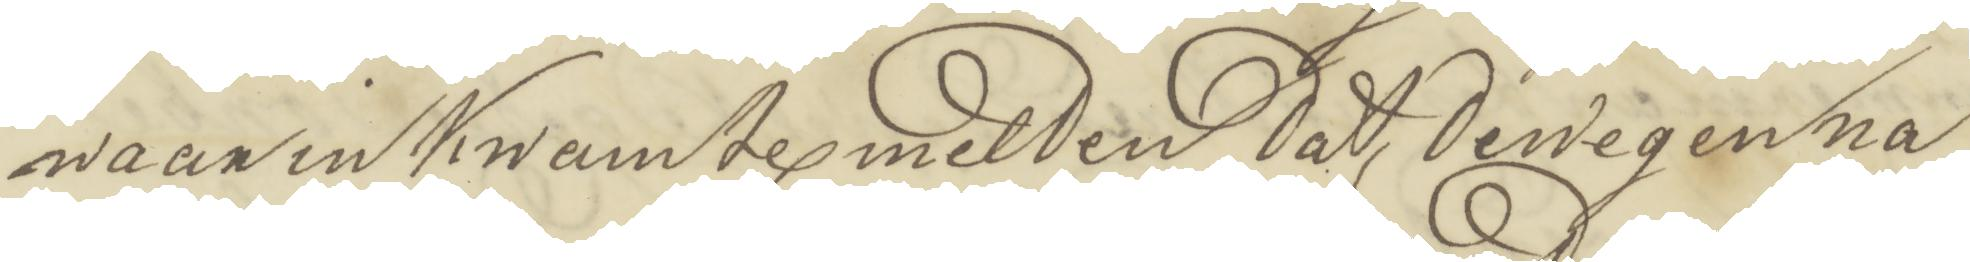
waar in Kwam te melden dat de wegen na
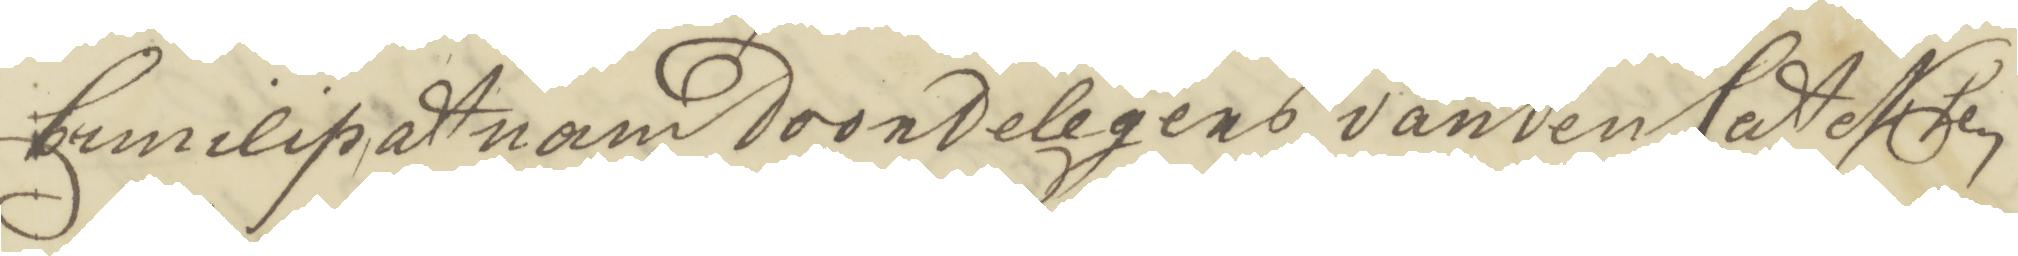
bimilipatnam door de legers van den Catekten
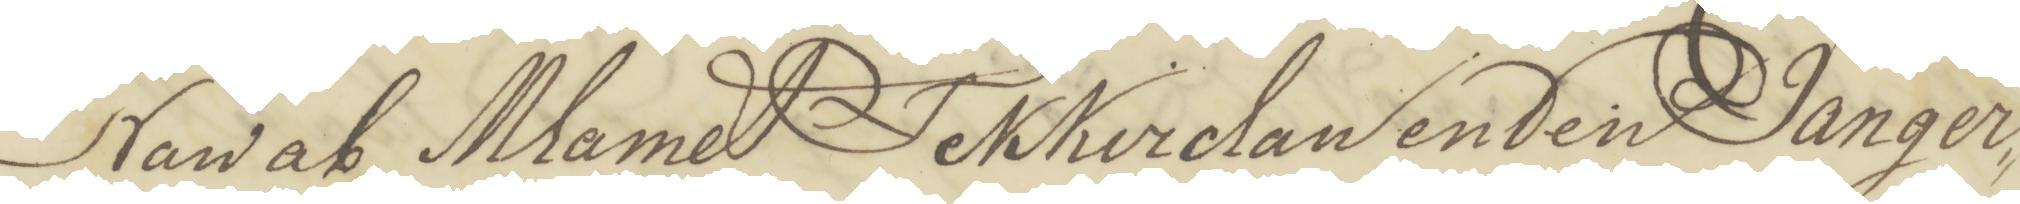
Nawab Mhamet Tekkirchan en den Ianger„
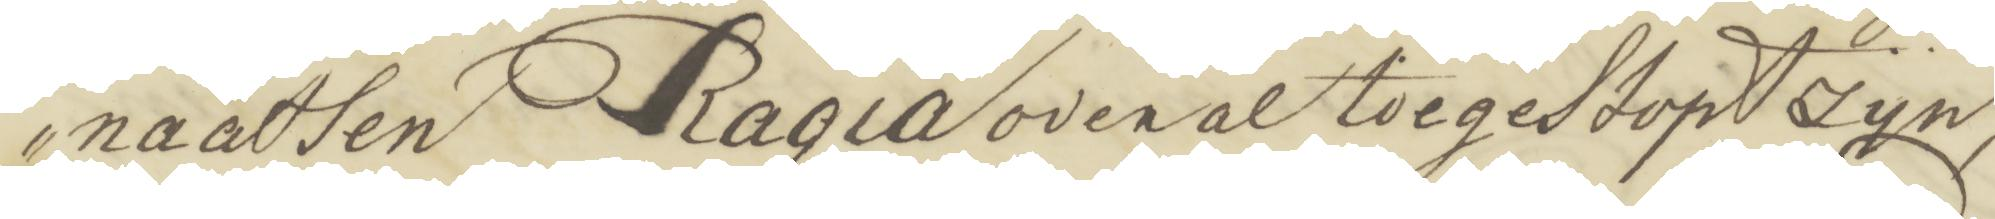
„naatsen Ragia over al toegestopt zijn,
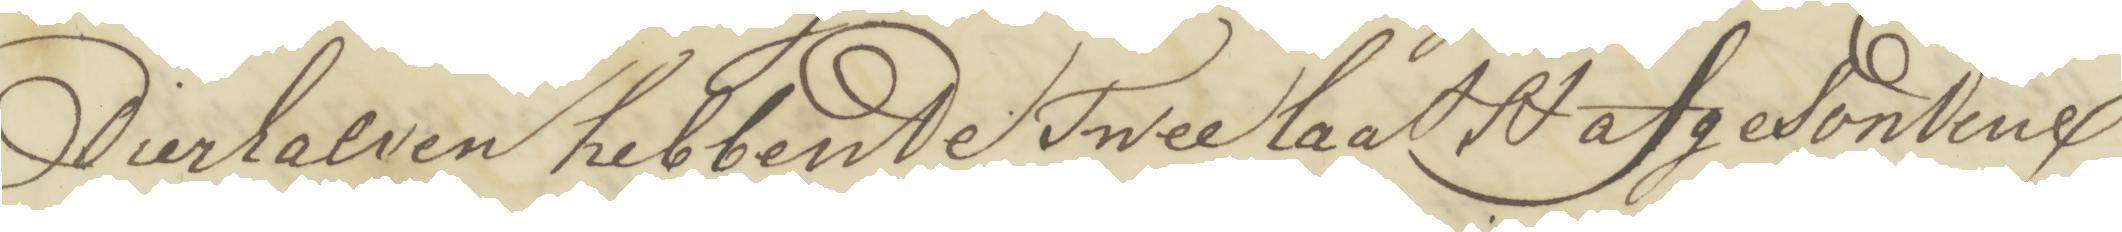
dierhalven hebbende Twee laatst afgesondene
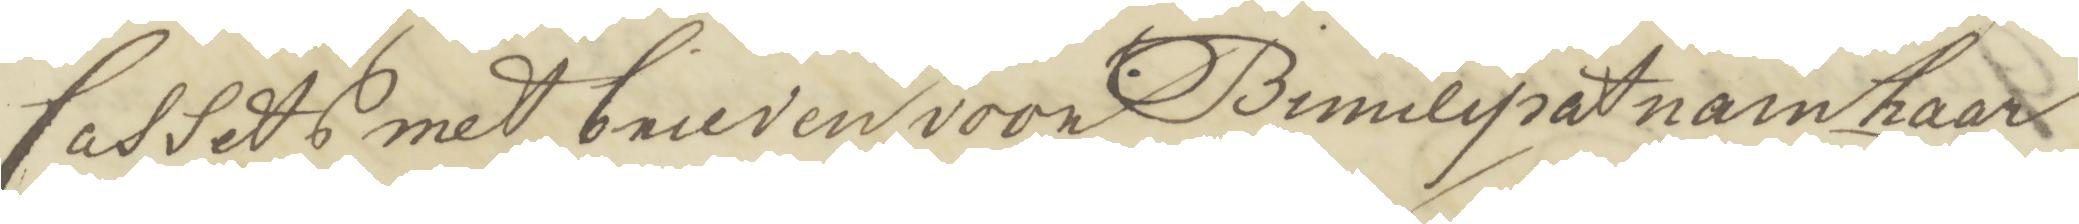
Cassets met brieven voor Bimilipatnam haar
